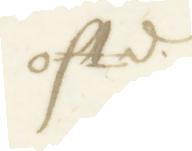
ofte.
